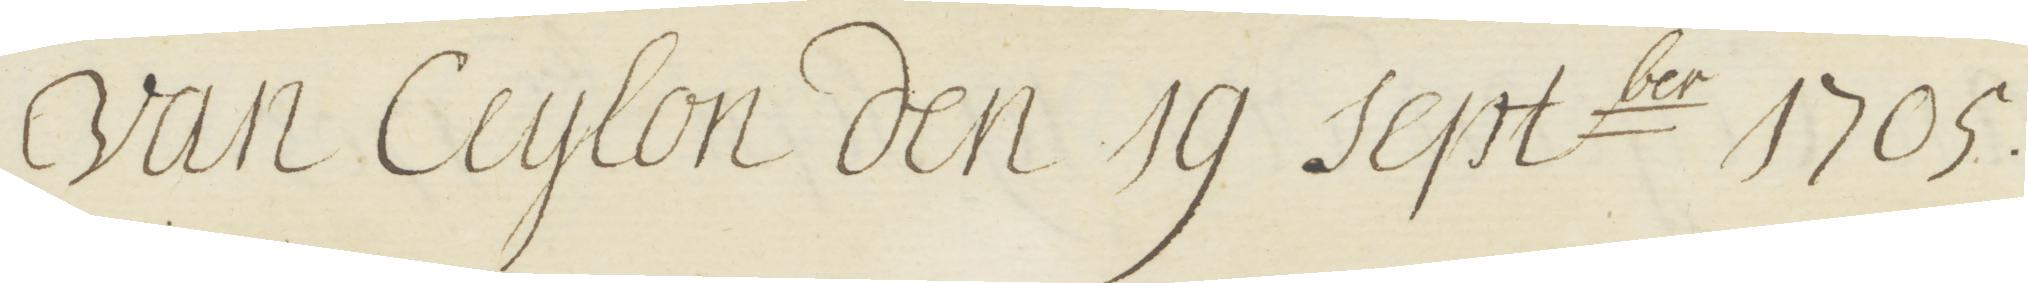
Van Ceijlon den 19 Sept=ber 1705.
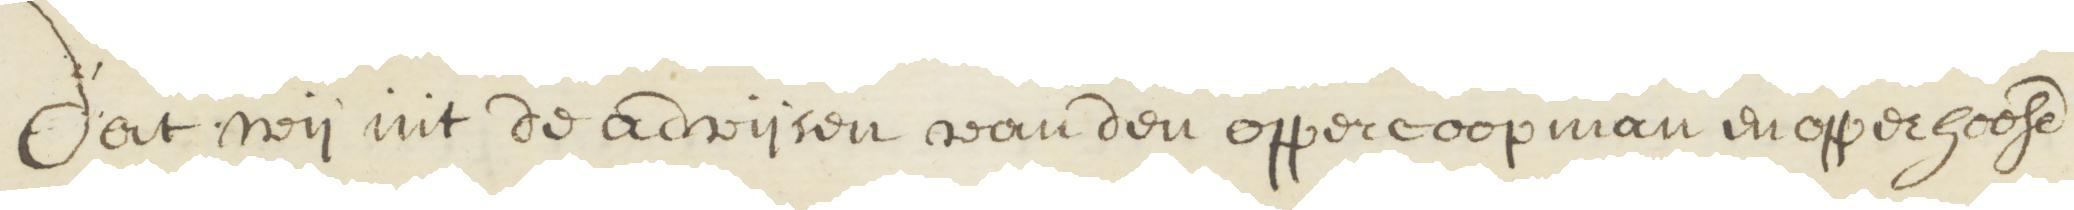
dat wij uit de advijsen van den oppercoopman en opperhoofd
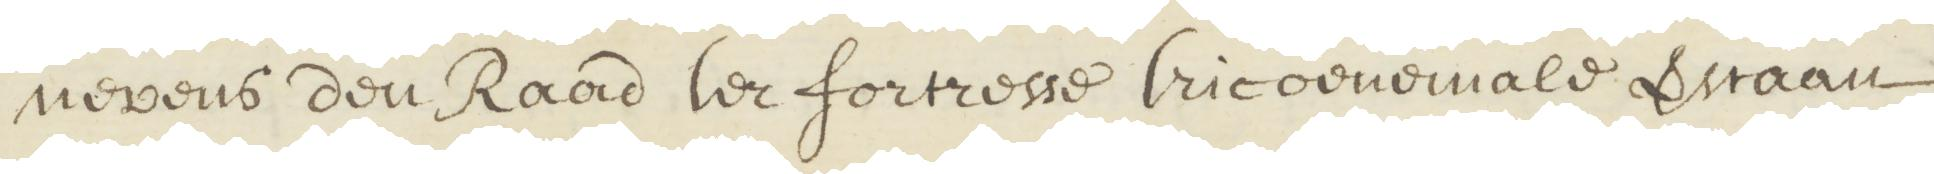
nevens den Raad ter fortresse tricoenemale verstaan
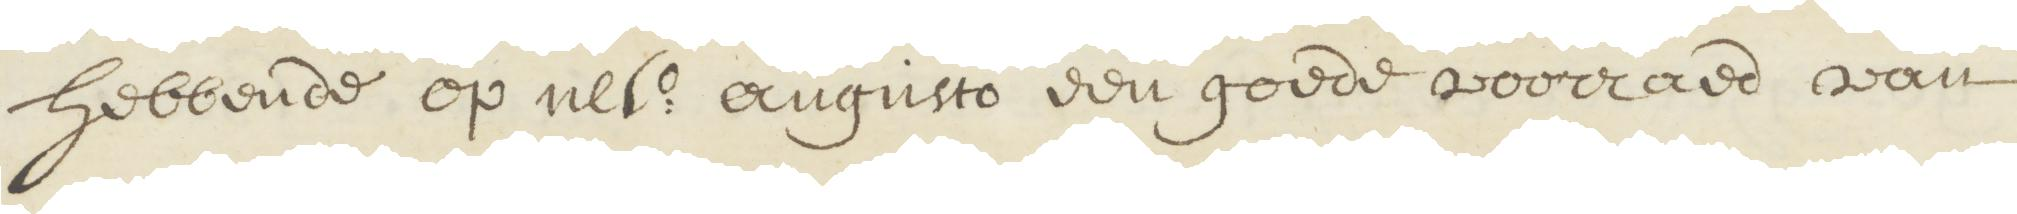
hebbende op ult:o augusto een goede voorraed van
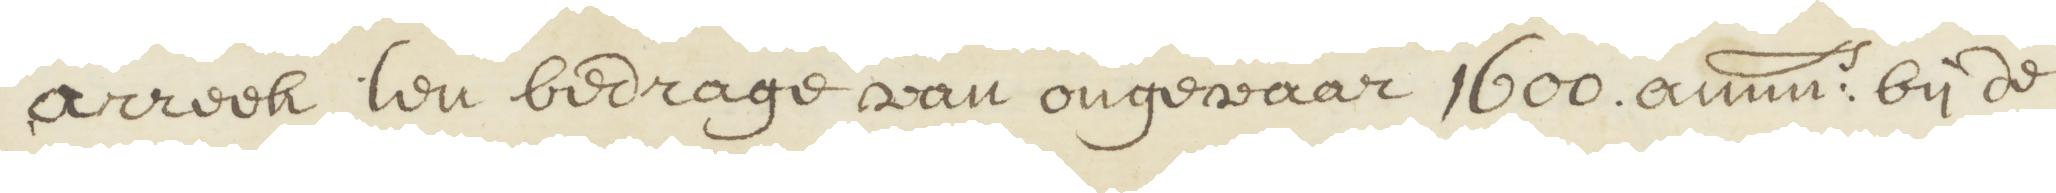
arreek ten bedrage van ongevaar 1600. amm:s bij de
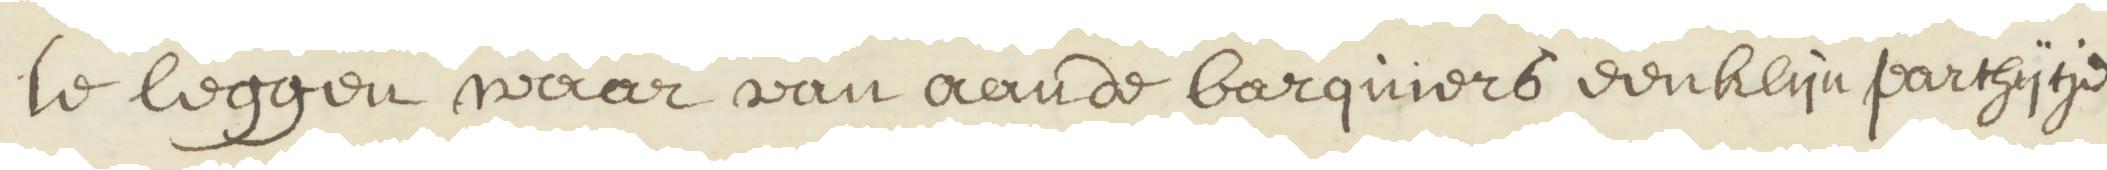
te leggen waar van aan de barquiers een klijn parthijtje
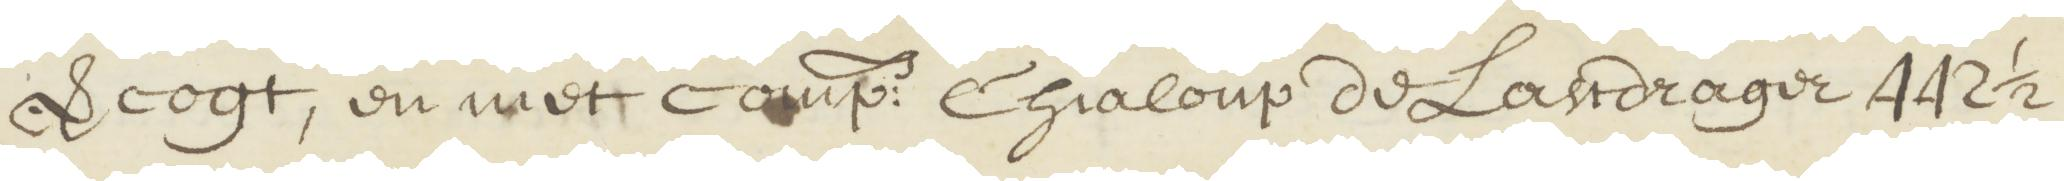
vercogt, en met comp:s Chialoup de Lastdrager 442½
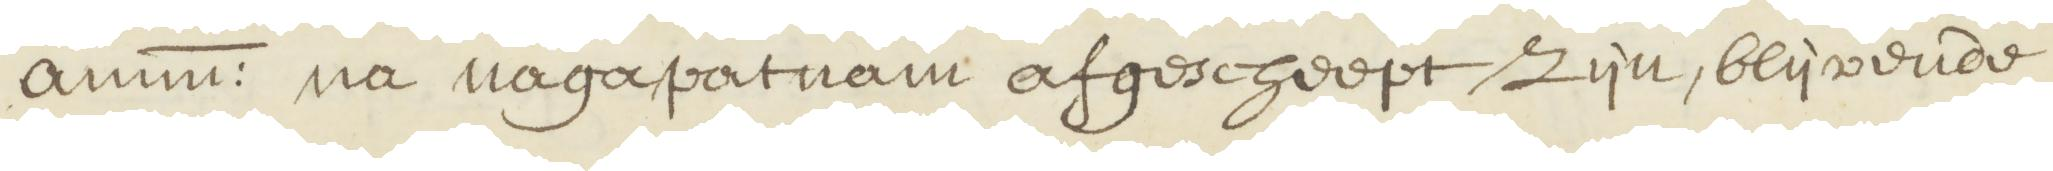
amm: na nagapatnam afgescheept zijn, blijvende
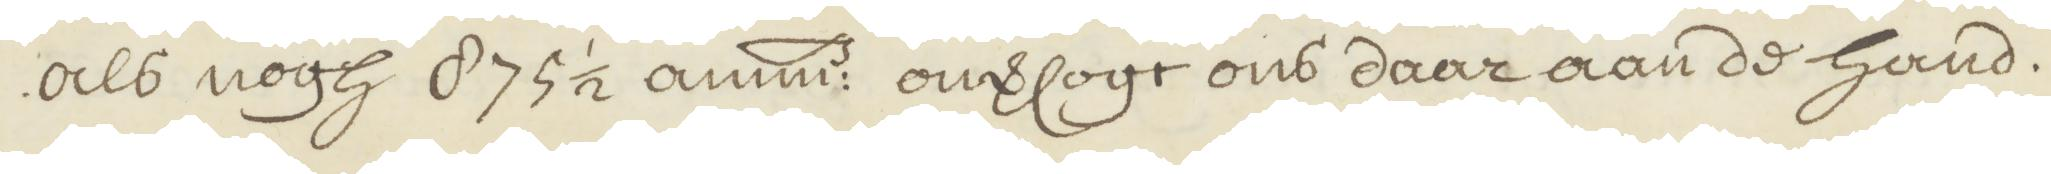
als nogh 875½ amm:s onvercogt ons daar aan de hand.
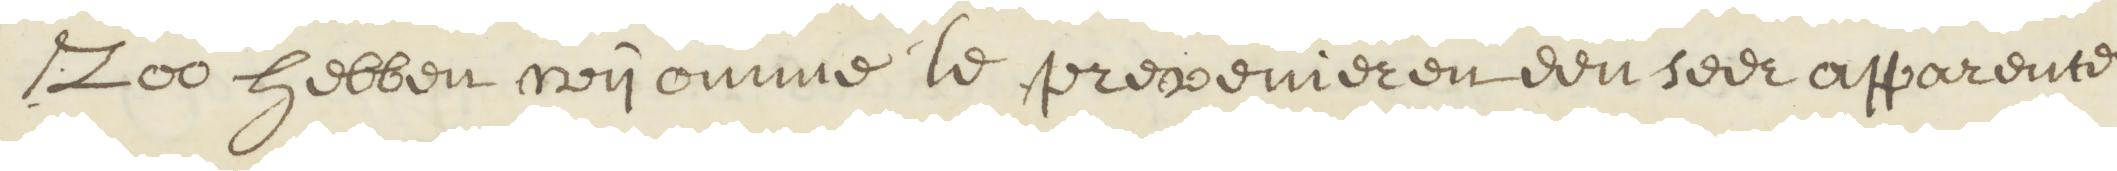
Zoo hebben wij omme te prevenieren een seer apparente
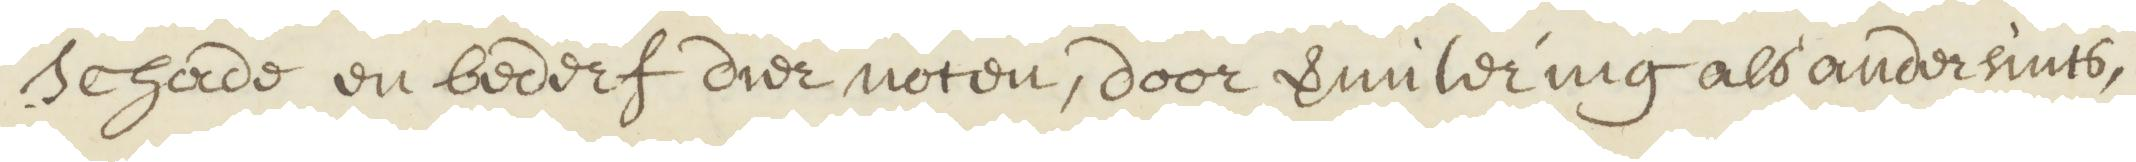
schade en bederf dier noten, door vermitering als ander sints,
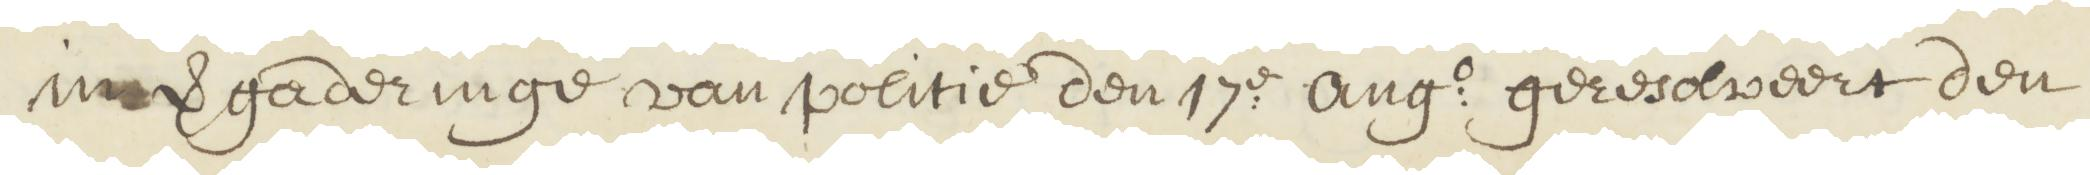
in vergaderinge van politie den 17:e Aug:o geresolveert den
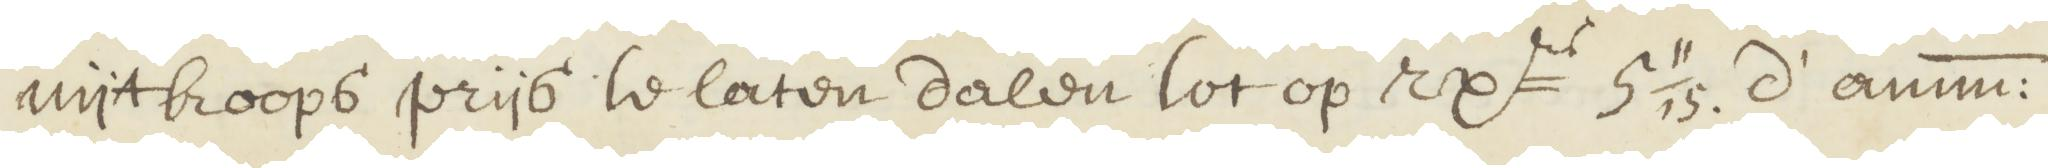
uijtkoops prijs te laten dalen tot op rx=s 5 11/15. d' amm:
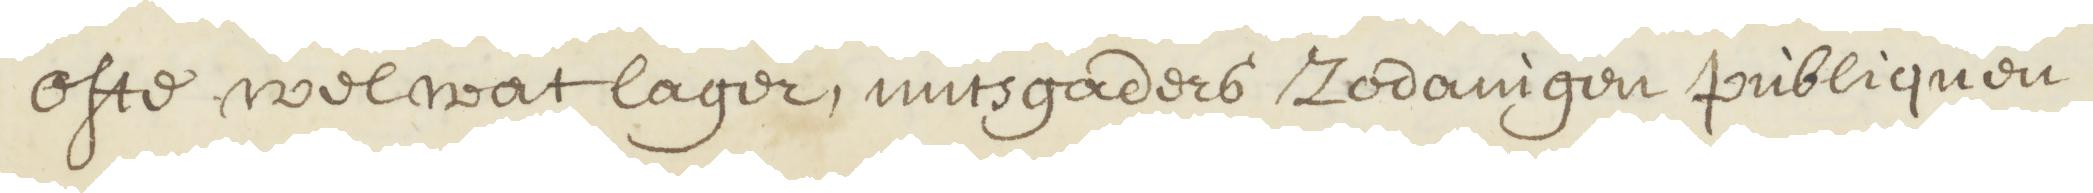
ofte wel wat lager, mitsgaders zodanigen publiquen
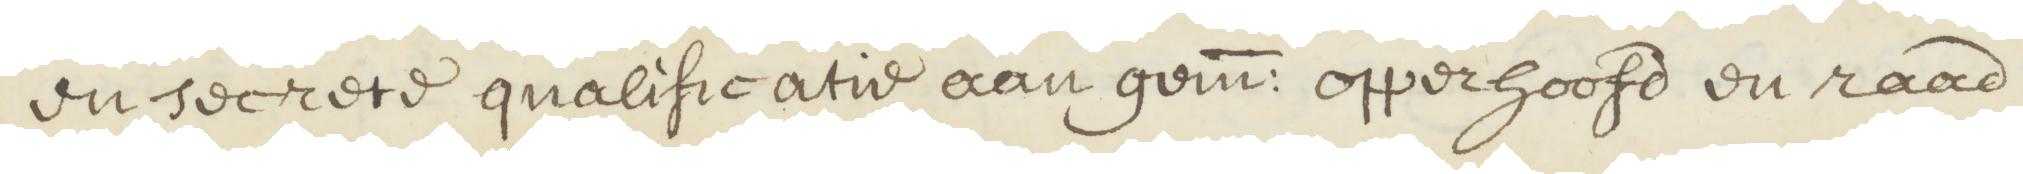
en secrete qualificatie aan gem: opperhoofd en raad
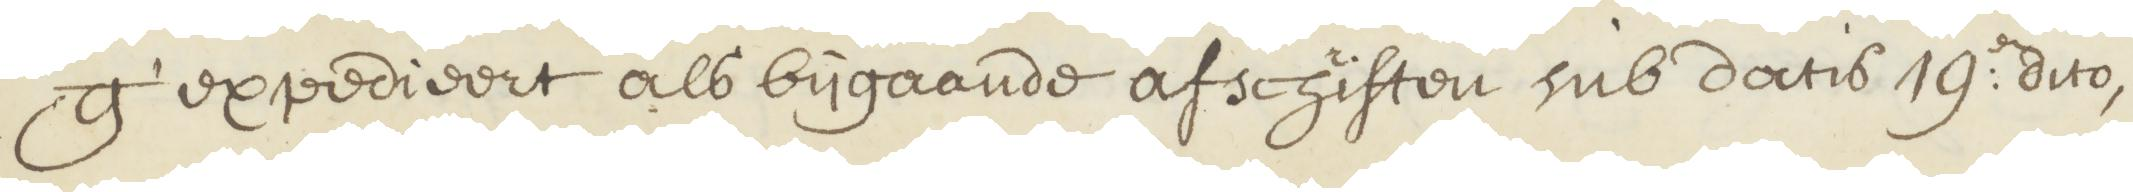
g’ expedieert als bijgaande afschiften sub datis 19:e dito,
